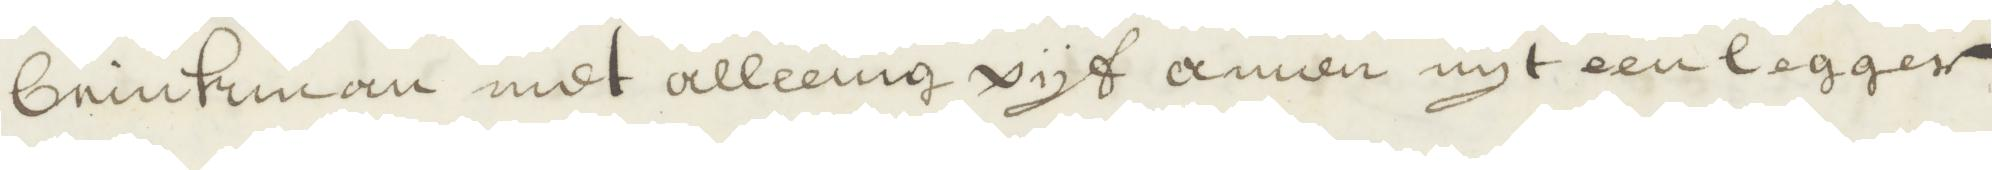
brinkman met alleenig vijf armen uijt een legger
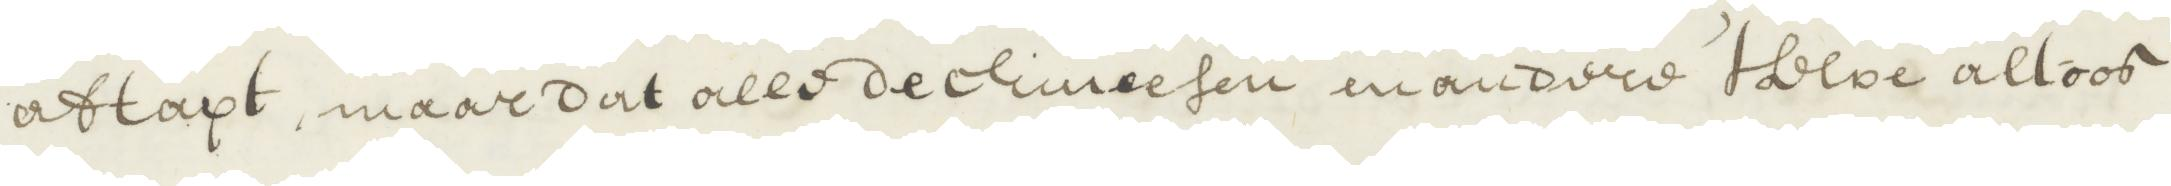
aftapt, maar dat alle de chineesen en andere 't selve altoos
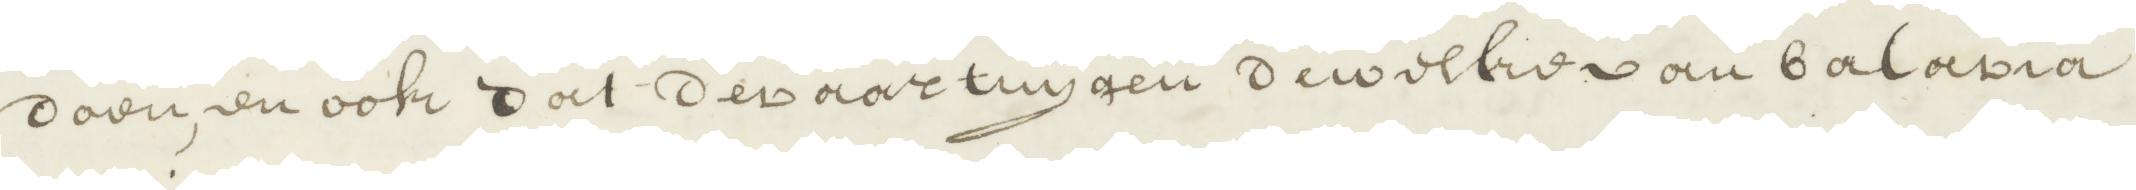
doen, en ook dat devaartuijgen dewelke van batavia
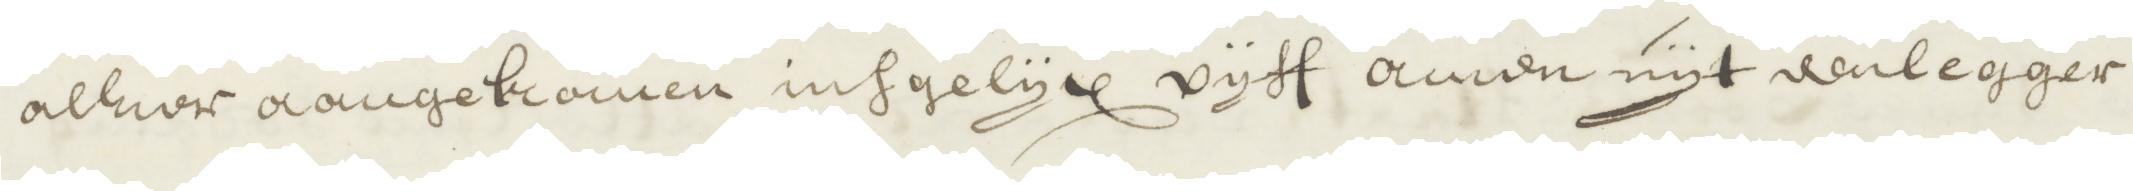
alhier aangekomen insgelijx vijff armen uijt eenlegger
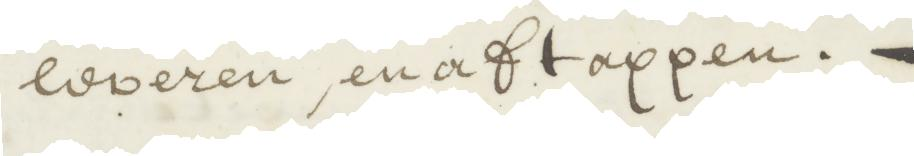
leveren, en aftappen.—
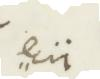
„hij
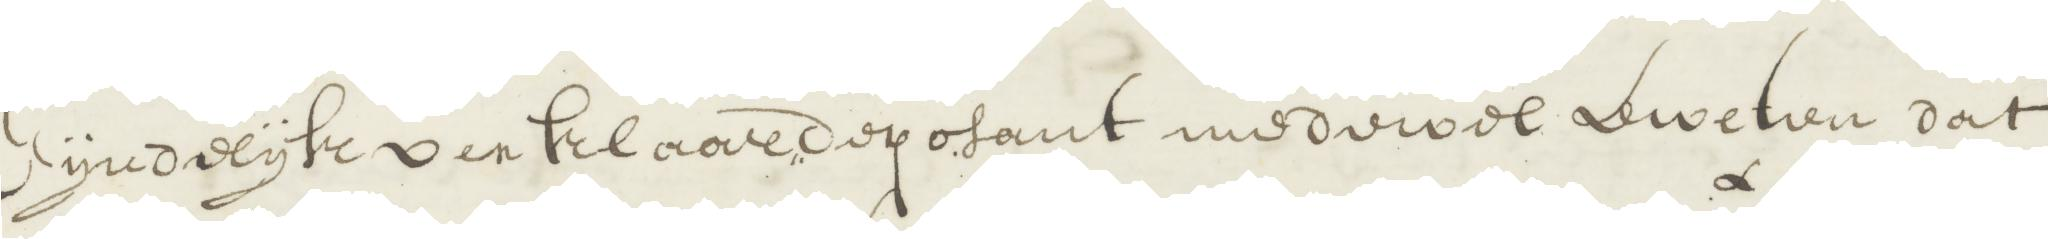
Eijndelijk verklaare „ deposant mede wel teweten dat
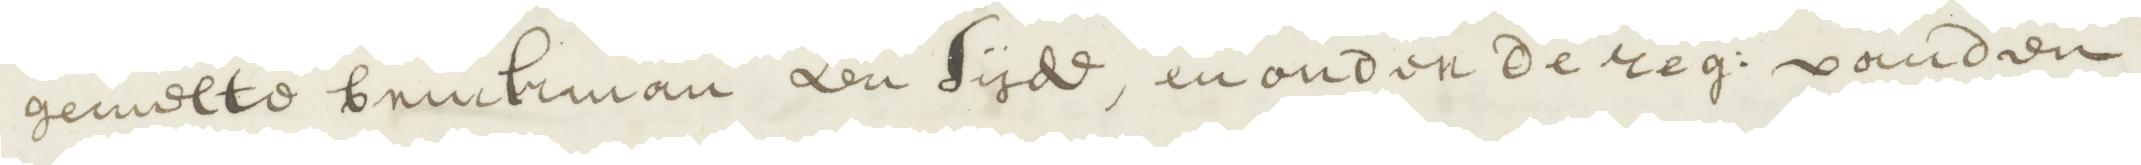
gemelte brinkman ten tijde, en onder de reg:s van den
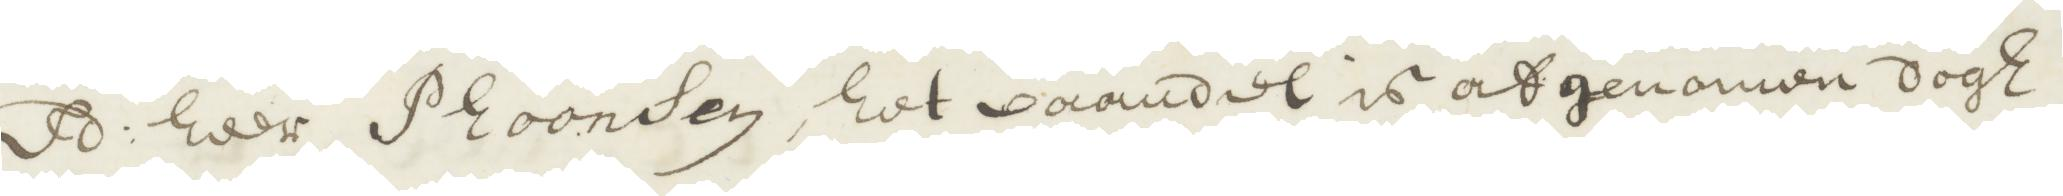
Ed: heer Phoonsen, het vaandel is afgenomen dogh
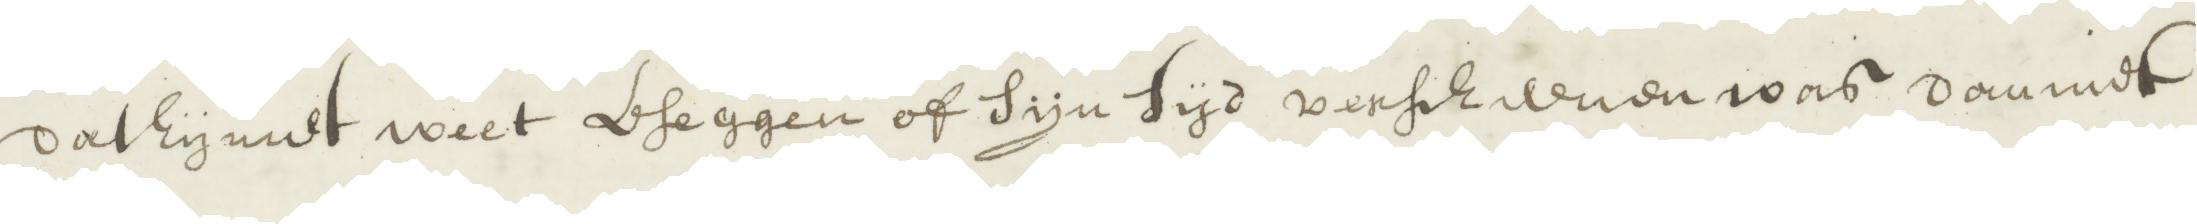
dat hij niet weet teseggen of sijn tijd verscheenen was dan niet
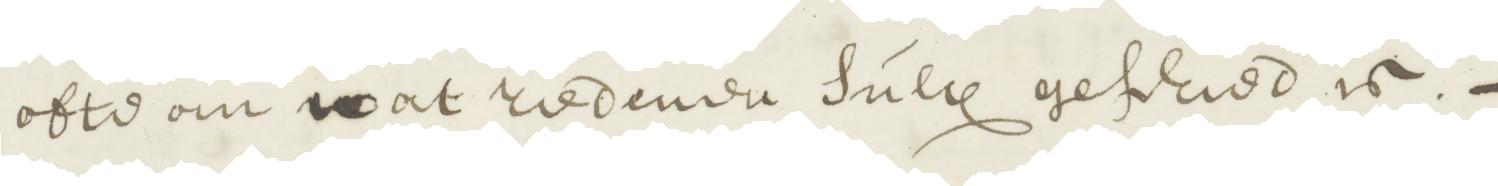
ofte om wat redenen sulx geschied is. —
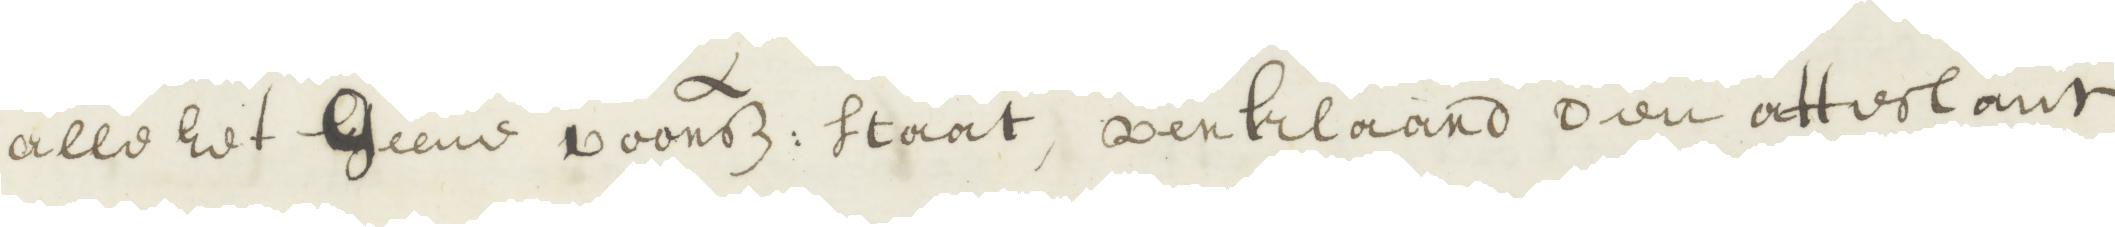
alle het Geene voors: staat, verklaard den attestant
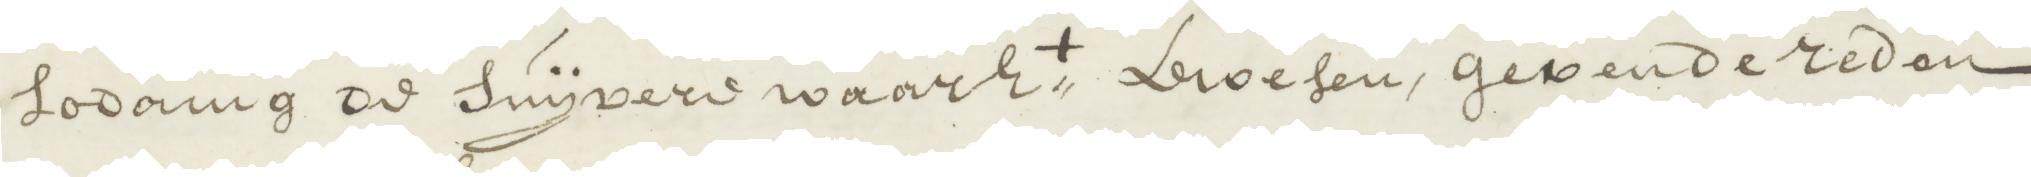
sodanig de suijvere waarh„t tewesen, gevende reden
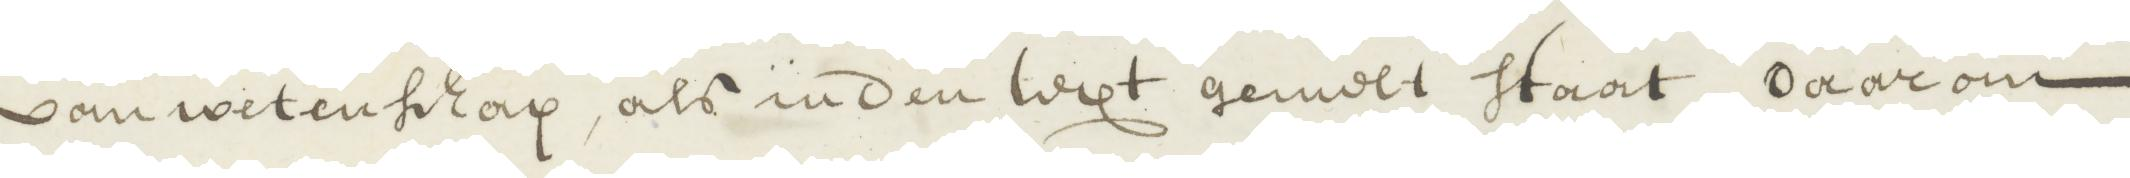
van wetenschap, als in den text gemelt staat, daarom
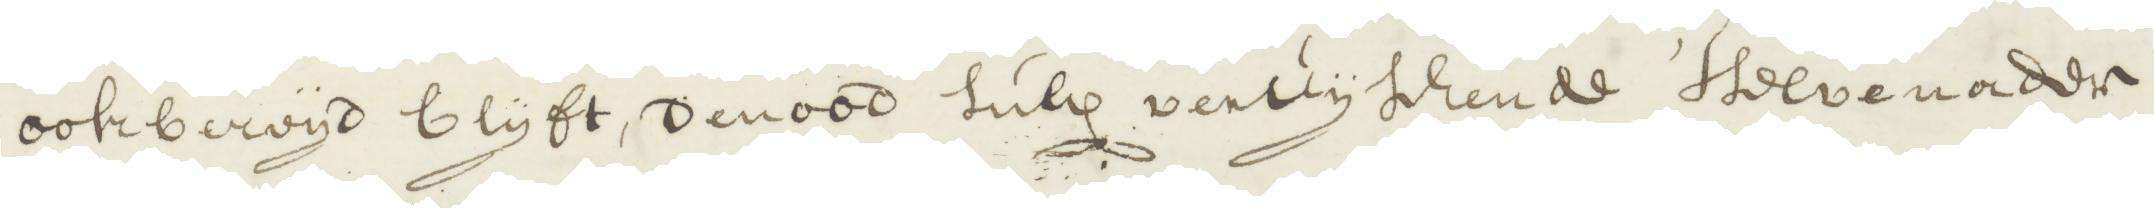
ook bereijd blijft, denood sulx verEijschende 't selve nader
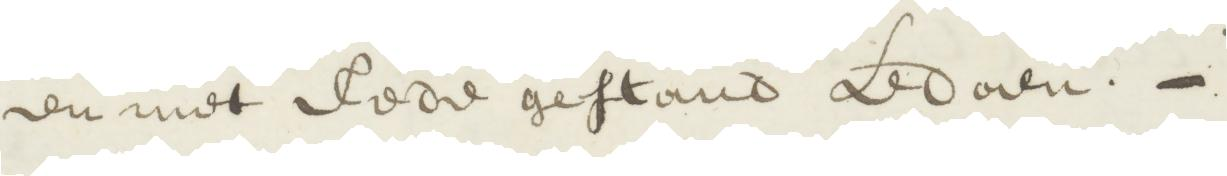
en met Eede gestand te doen. —
